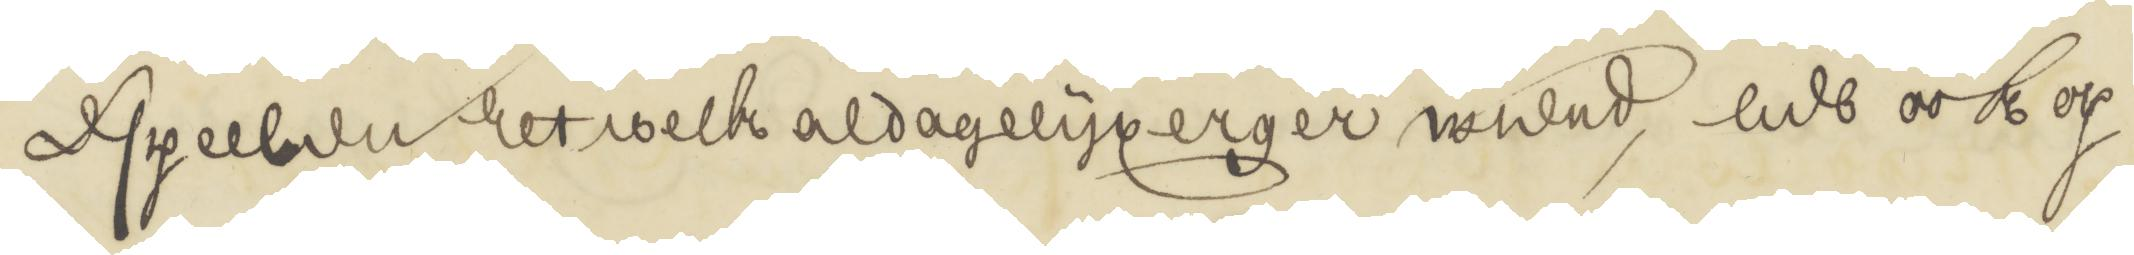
tespeelen het welk aldagelijx erger wierd, heb ook op
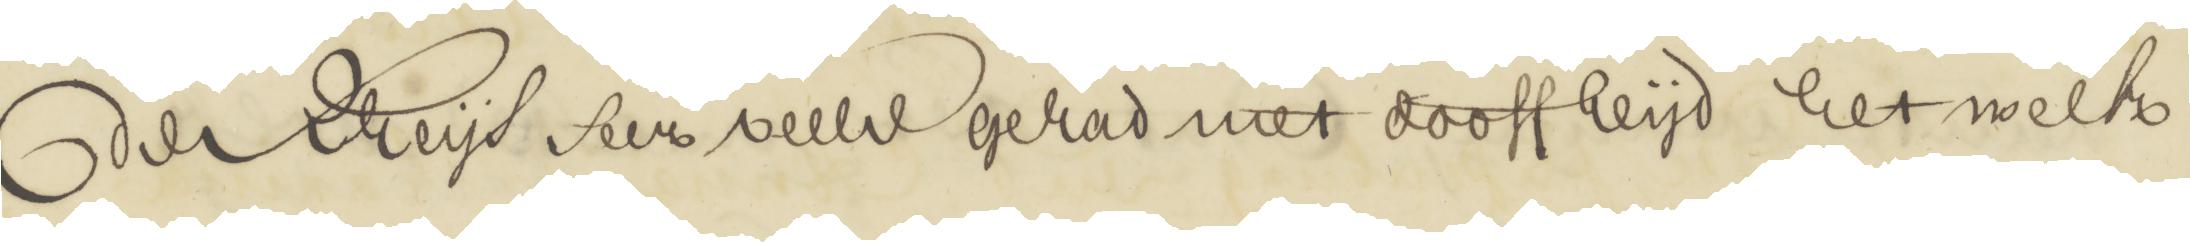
de Rheijs seer veele gehad met dooffheijd het welk
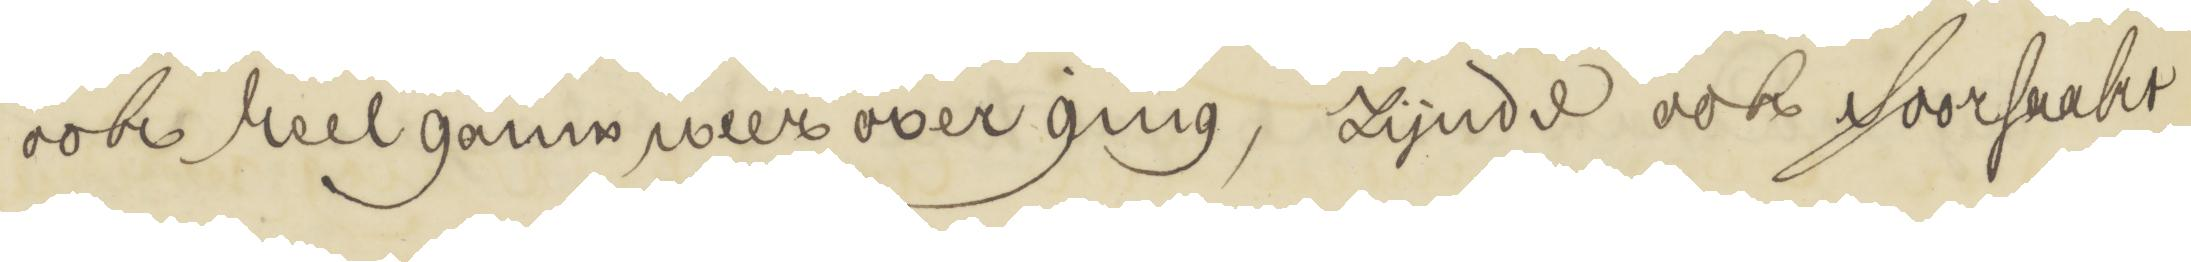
ook heel gauw weer over ging, zijnde ook veroorsaakt
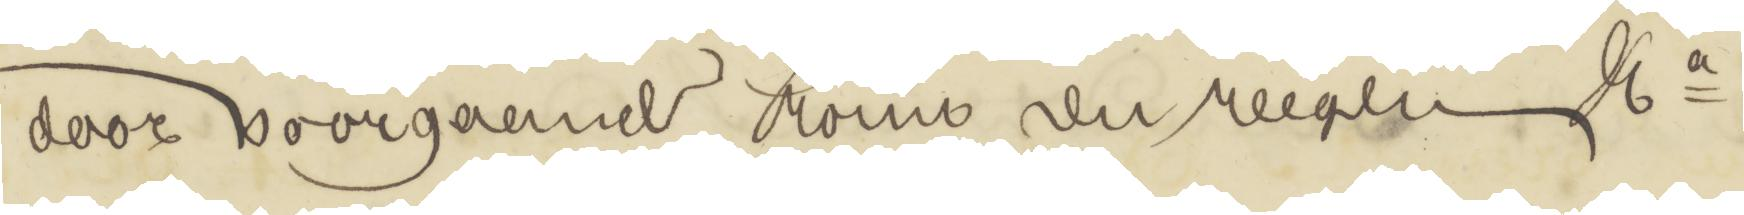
door voorgaande kouw en reegen &=a
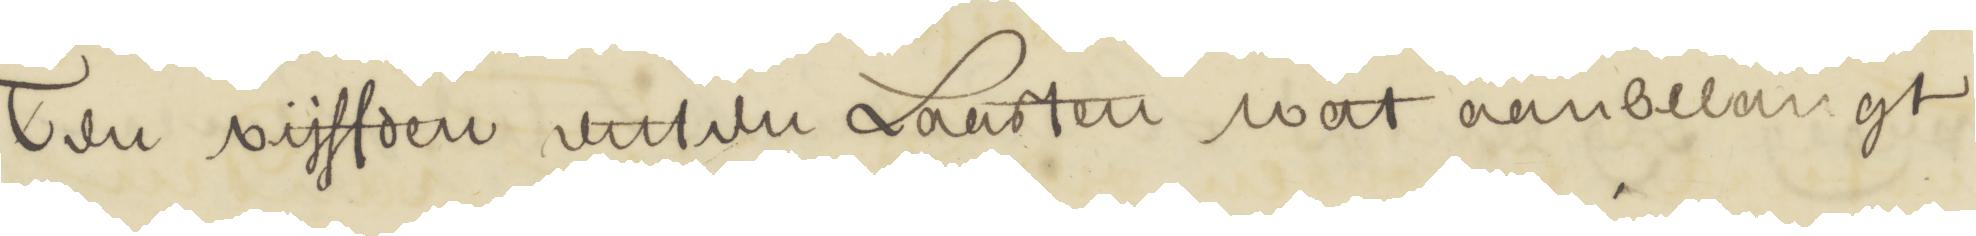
Een vijffden enten Laasten wat aanbelangt
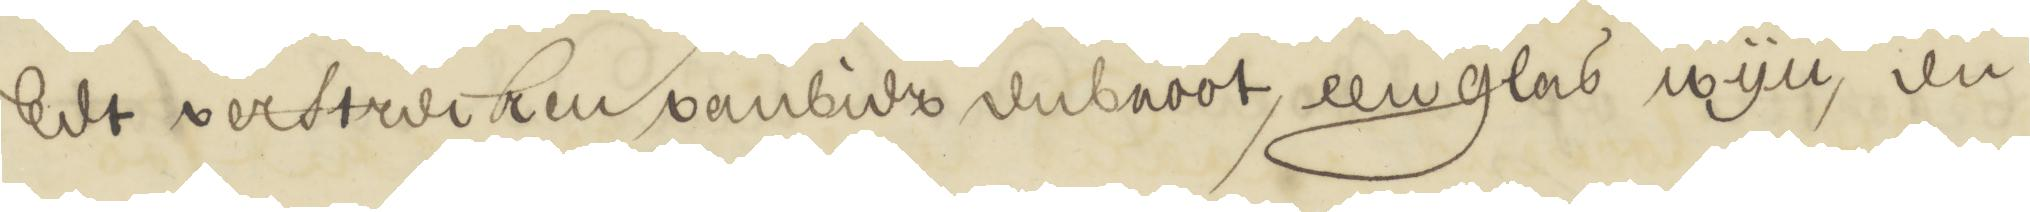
het verstrecken van bier en broot, een glas wijn, en
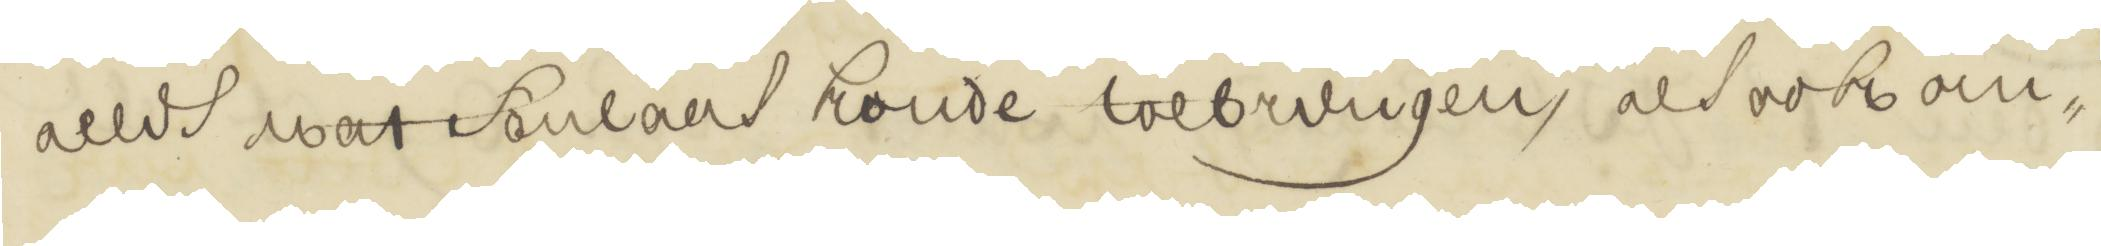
alles wat soulaas konde toebrengen, als ook om„
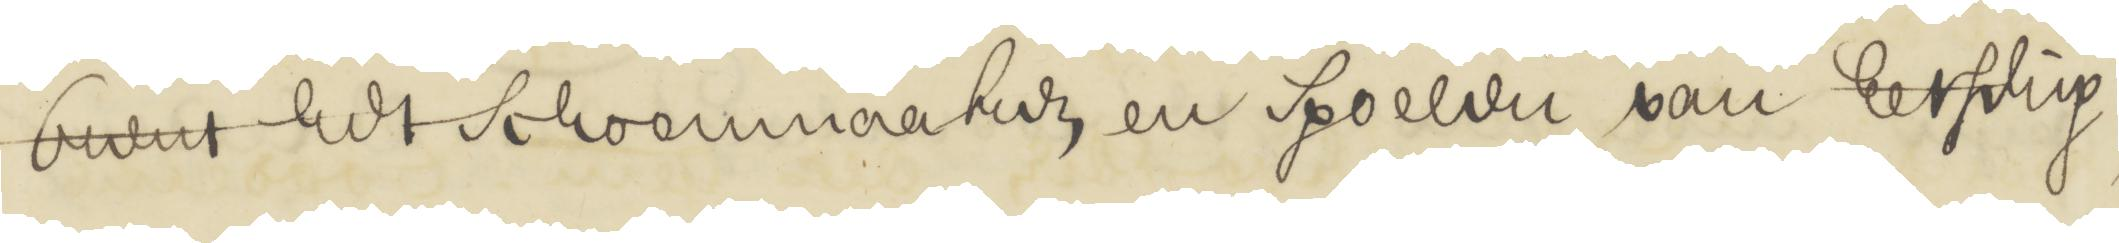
trent het schoonmaaken en spoelen van hetschip
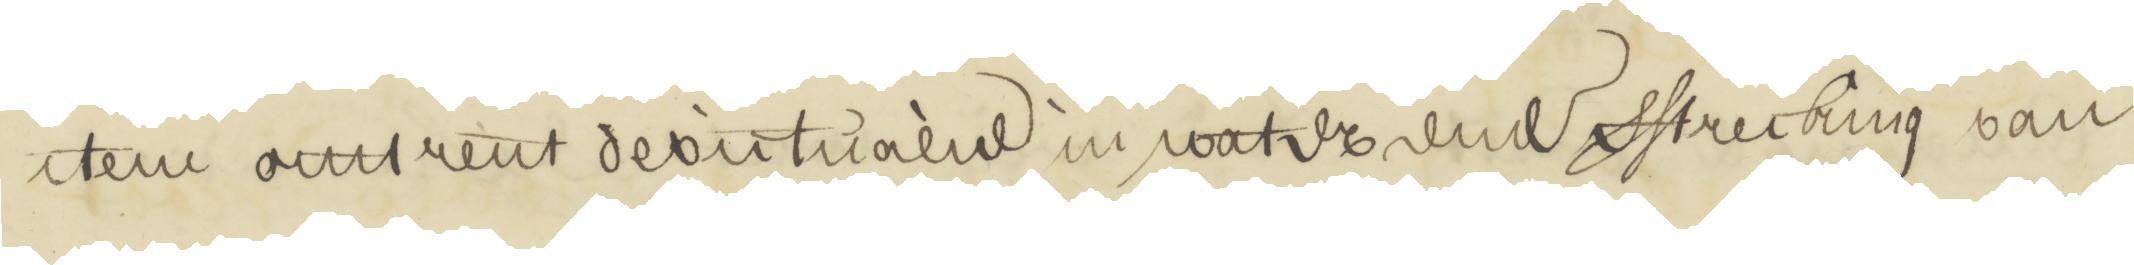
item omtrent devictualie in water ende verstrecking van
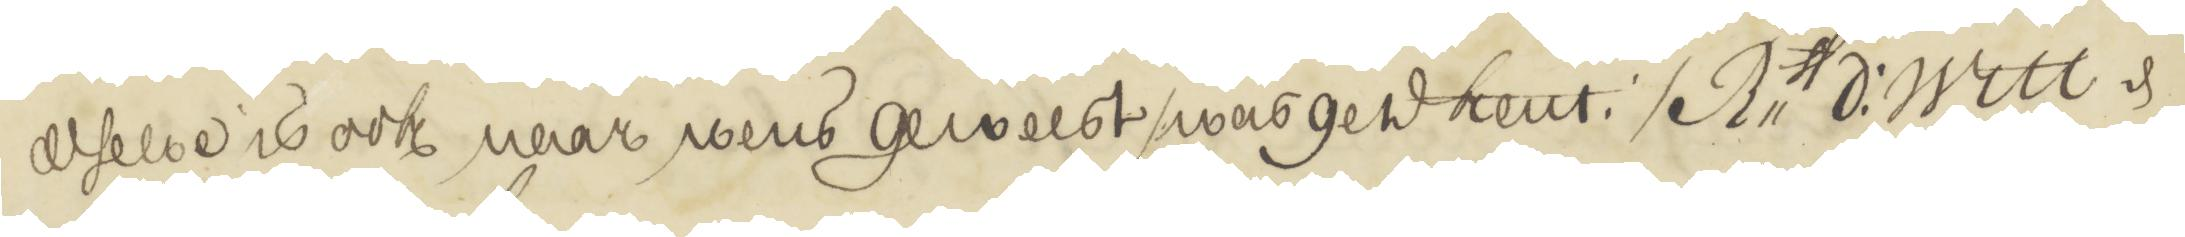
deselve is ook naar wens geweest / was getekent:/ R„ss d: Witt en
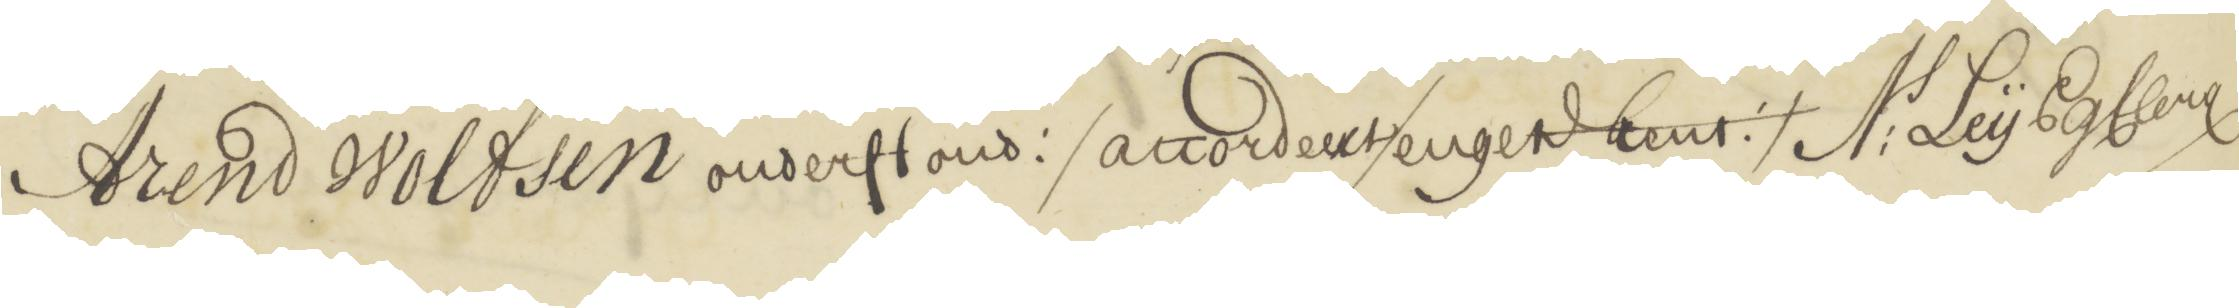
Arend Wolfsen onderstond :/ accordeert/en getekent:/ A:s Leij Eg Clerq
